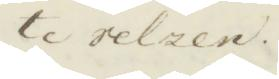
te velzen.
